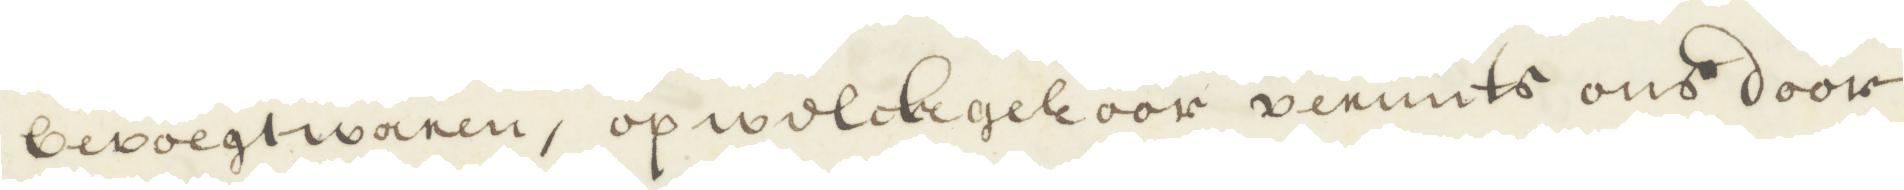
bevoegtwaren, op welck gehoor vermits ons door
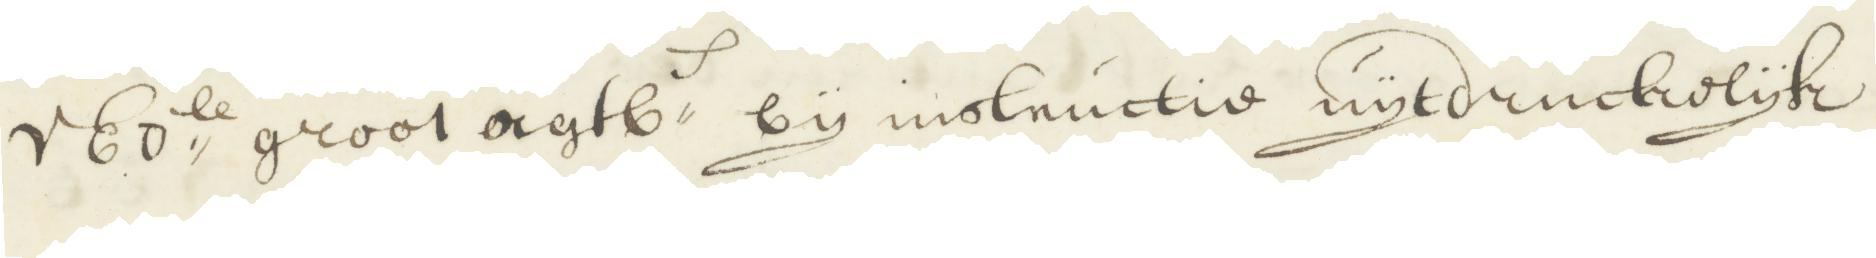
VEd„le groot agtb„s bij instructie uijtdruckelijk
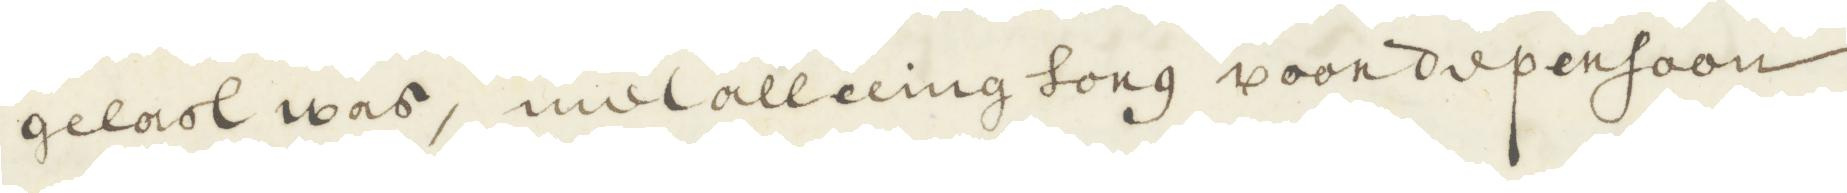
gelast was, niet alleenig sorg voor de persoon
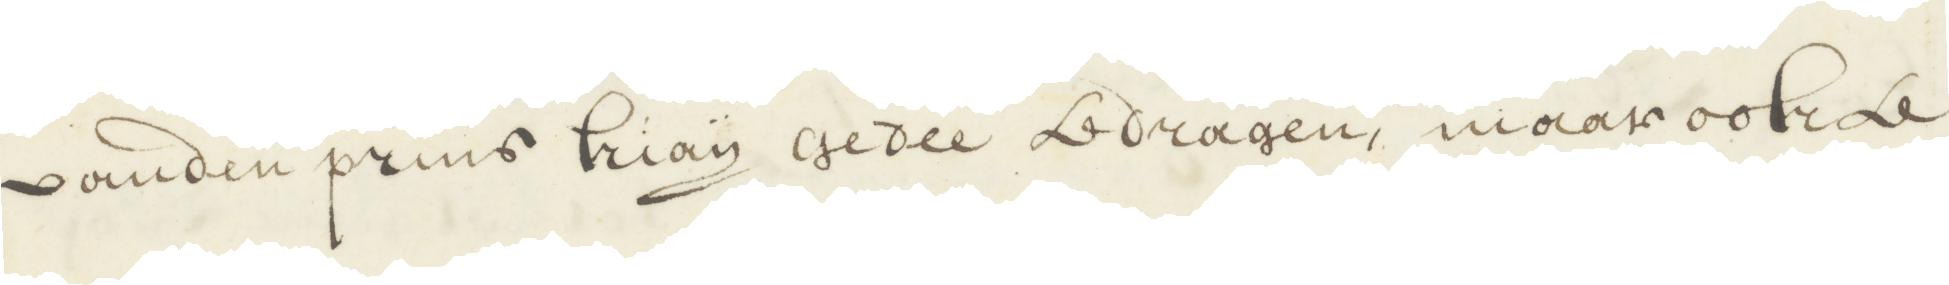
van den prins kiaij gedee te dragen, maar ook te
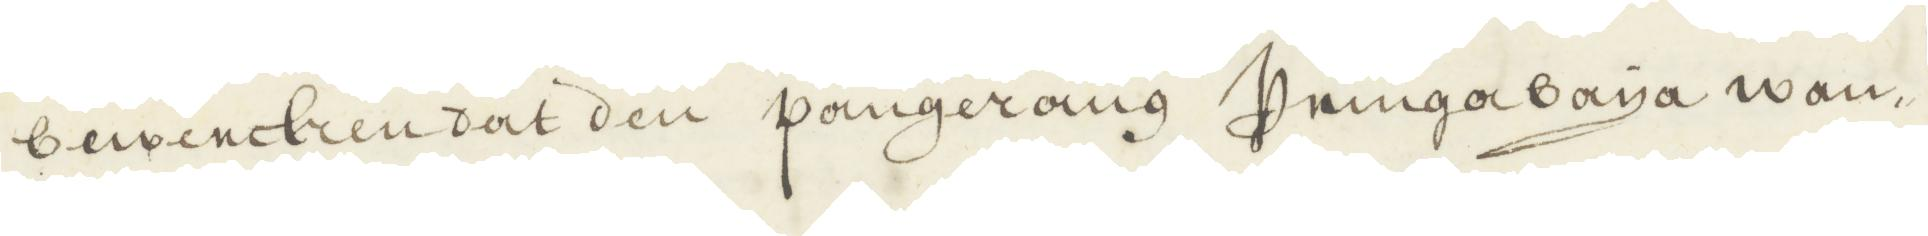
bewercken dat den pangerang Pringabaija wan„
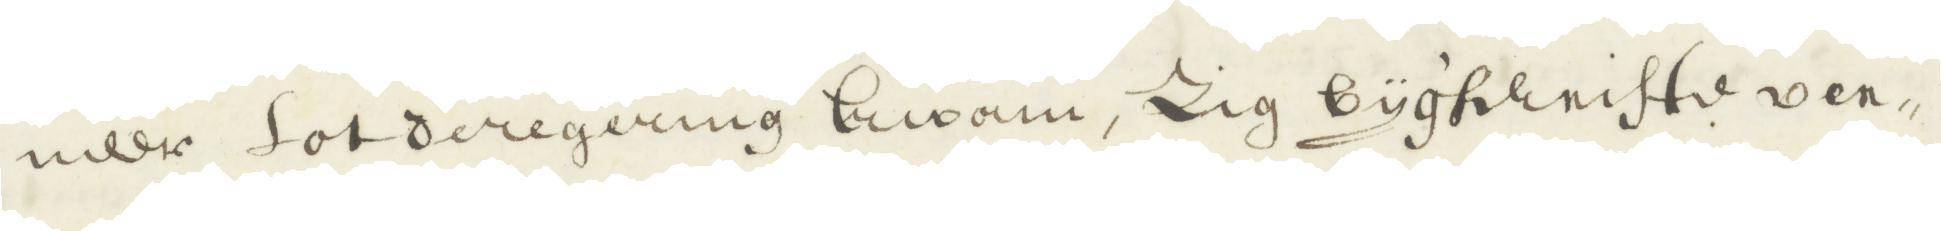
neer tot deregering kwam, zig bijg'schrifte ver„
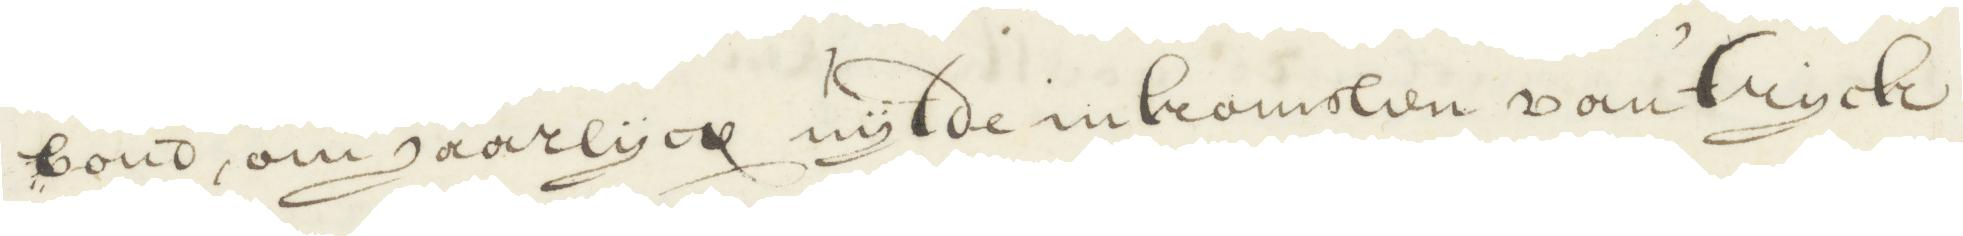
„bond, om jaarlijcx uijtde inkomsten van 't rijck
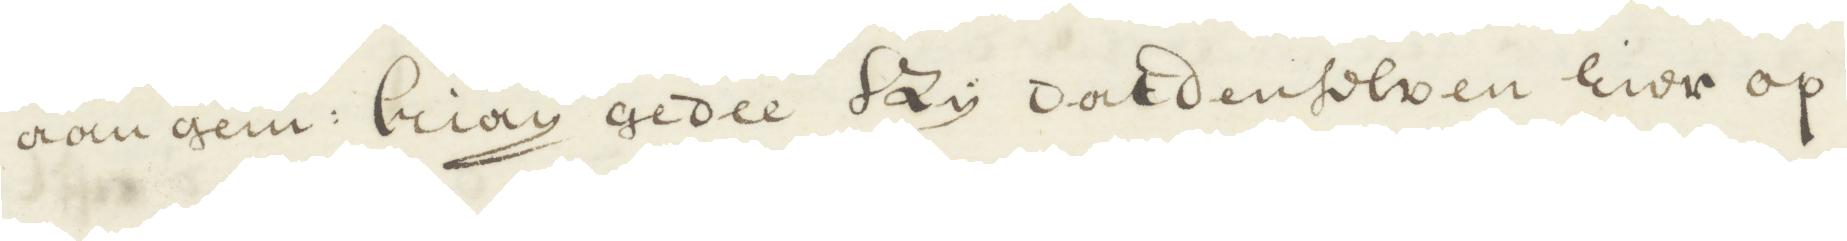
aan gem: kiay gedee 'tzij dat denselven hier op
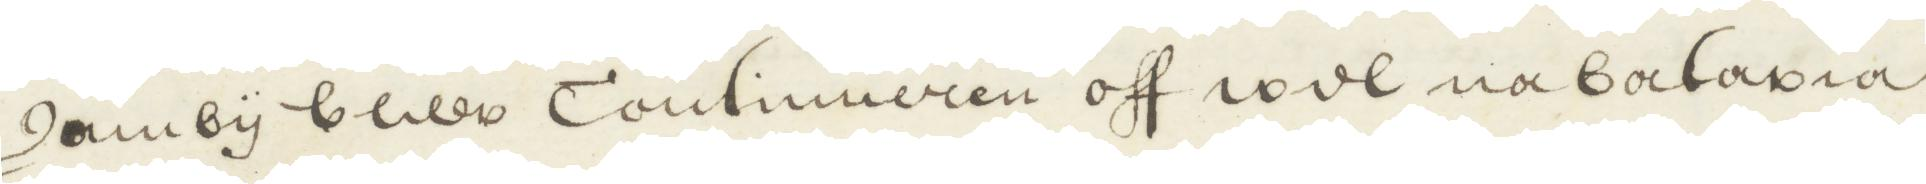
Jambij bleev Continueren off wel na batavia
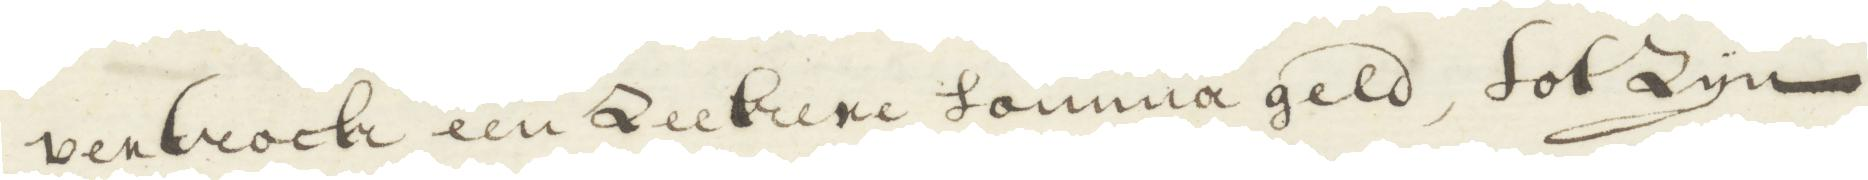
vertrock een zeekere somma geld, tot zijn
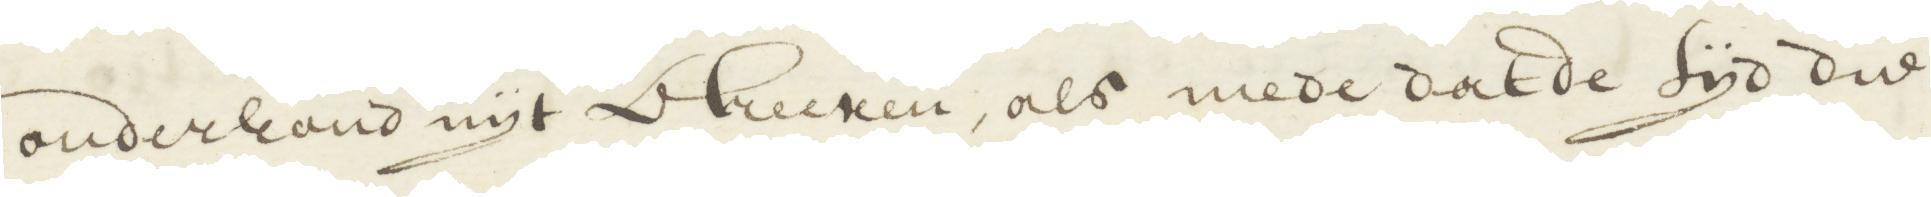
onderhoud uijt te keeren, als mede dat de tijd die
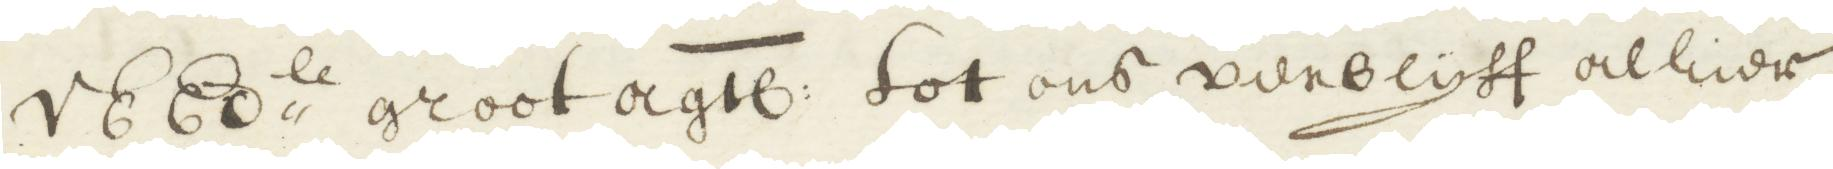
VE Ed„le groot agtb: tot ons verblijff alhier
